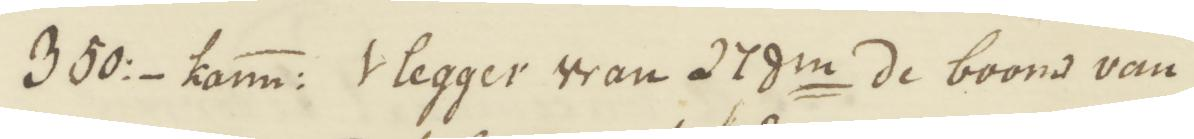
350: — kann: 1 legger wan 27 d=m de boom van
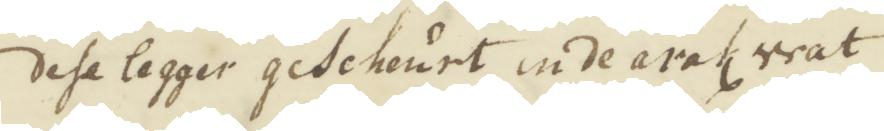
dese legger gescheurt en de arak wat
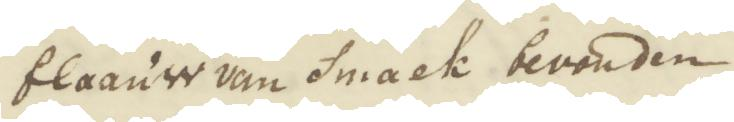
flaauw van smaek bevonden
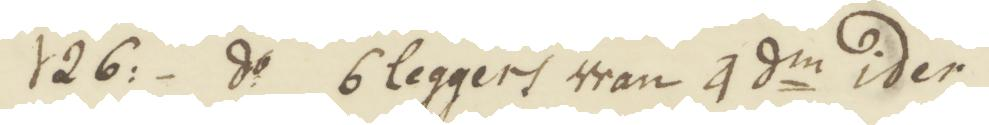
126: — d:o 6 leggers wan 4 d=m ider
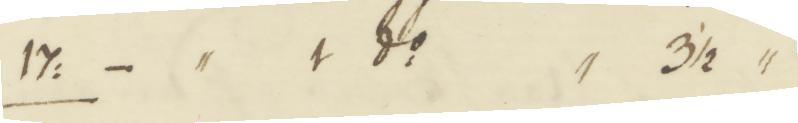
17: — „ 1 d:o „ 3½ „
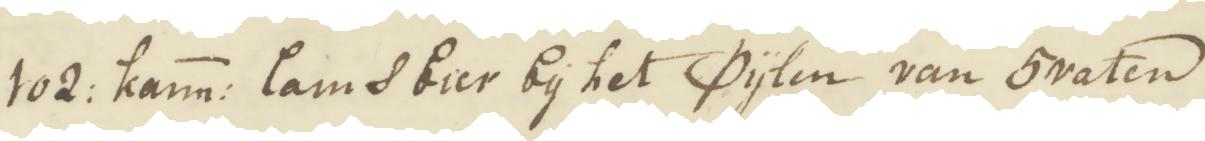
102: kann: lams bier bij het pijlen van 5 vaten
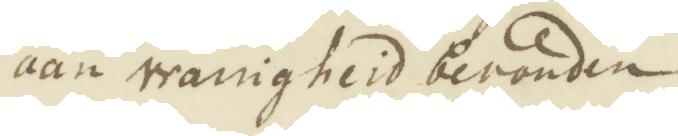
aan wanigheid bevonden
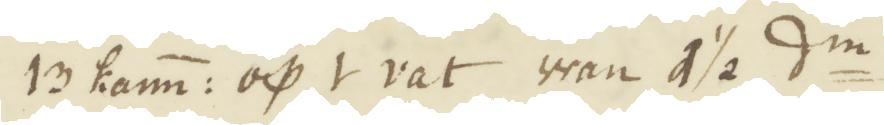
13 kann: op 1 vat wan 4½ d=m
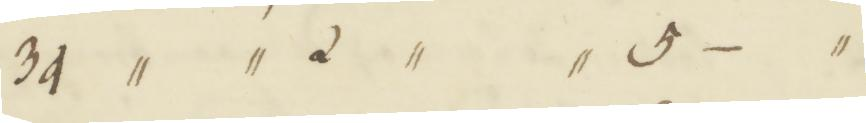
34 „ „ 2 „ „ 5 — „
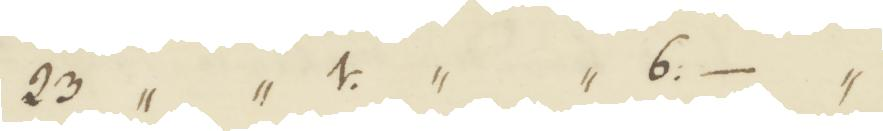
23 „ „ 1. „ „ 6: — „
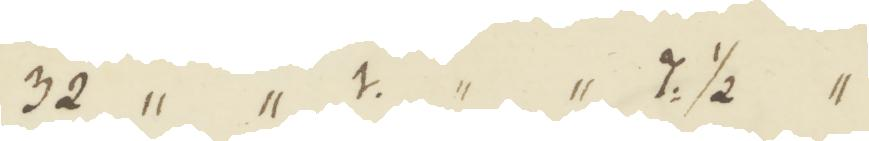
32 „ „ 1. „ „ 7: ½ „
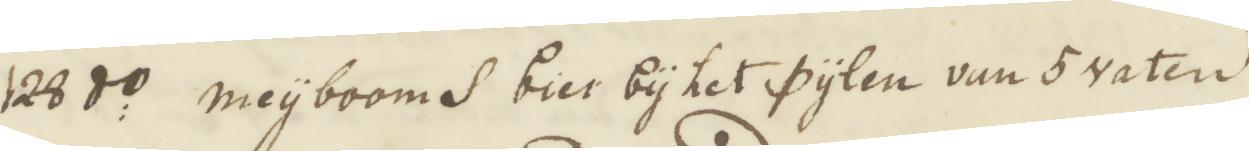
128 d:o meijbooms bier bij het pijlen van 5 vaten
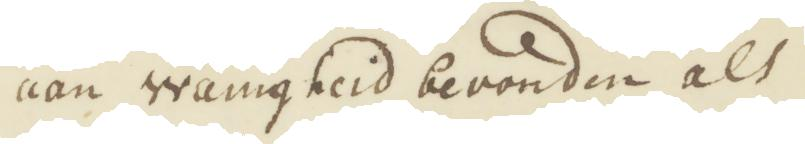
aan wanigheid bevonden als
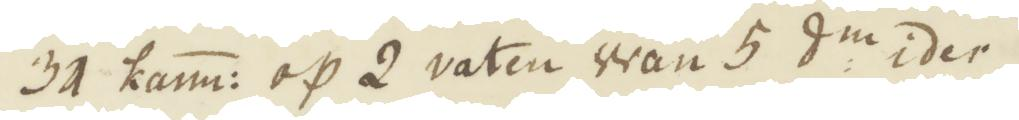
34 kann: op 2 vaten wan 5 d:m ider
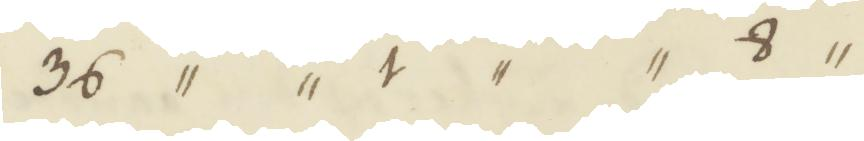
36 „ „ 1 „ „ 8 „
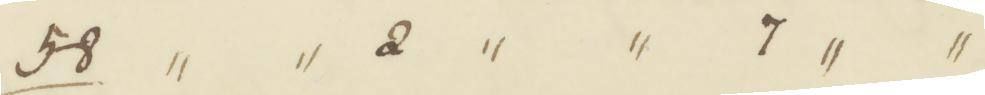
58 „ „ 2 „ „ 7 „ „
